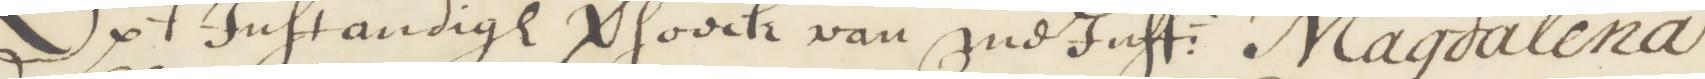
Op 't Instandigh versoeck van meJuff:-r Magdalena
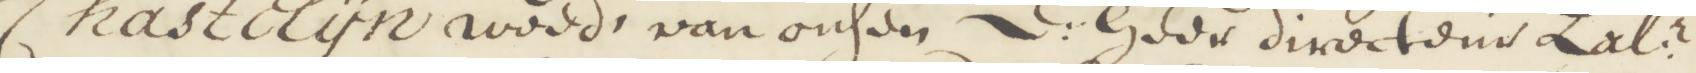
Chastelijn weed. van onsen E: heer directeur Zal:r
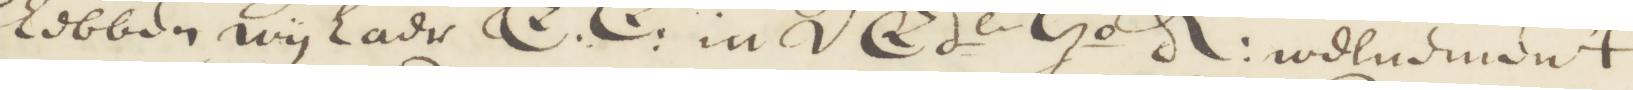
hebben wij haer E.E. in VEd-le H-o A: welnemen 't
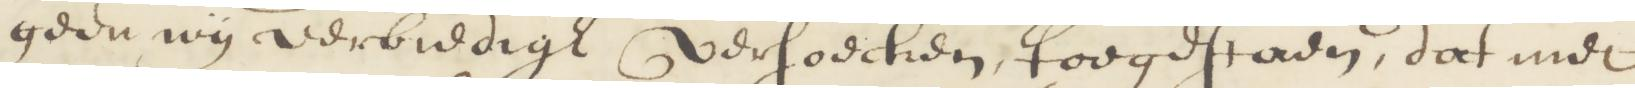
geen wij verbiedigh versoecken, toegestaen, dat met
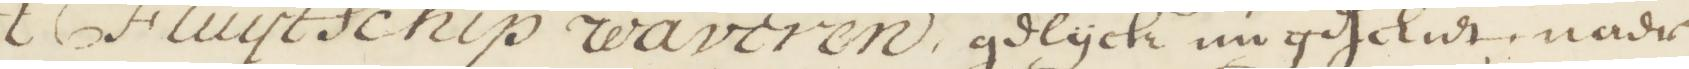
't Fluijtschip waveren gelijck in geschut, naer
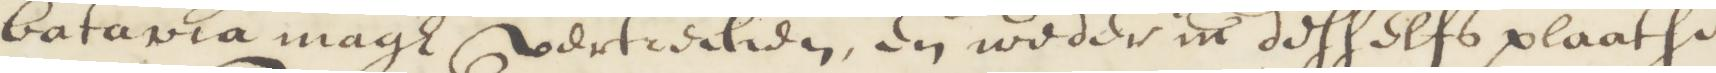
batavia magh vertrecken, en weder in desselfs plaatse
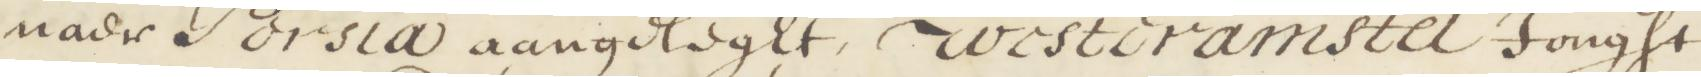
naer Persia aangeleght, westeramstel Jongst
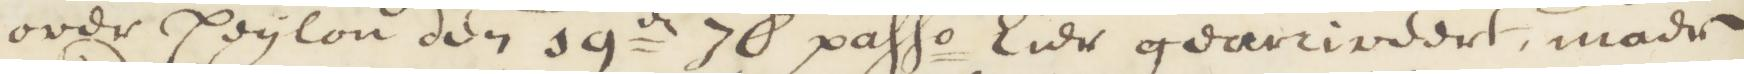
over Ceijlon den 19=en Passo= hier gearriveert, maer
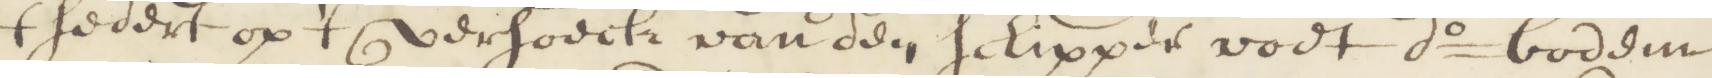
t sedert op 't versoeck van den schipper voet d=o bodem
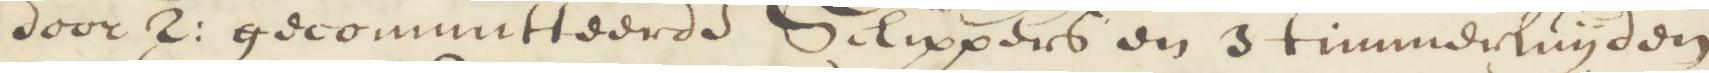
door 2: gecommitteerde Schippers en 3 timmerluijden
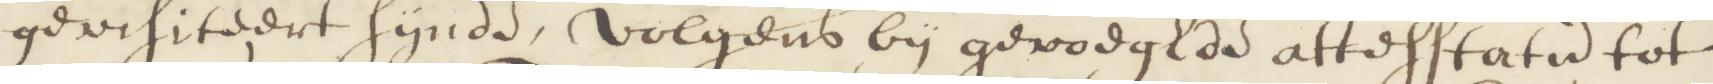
gevisiteert sijnde, volgens bij gevoeghde attestatie tot
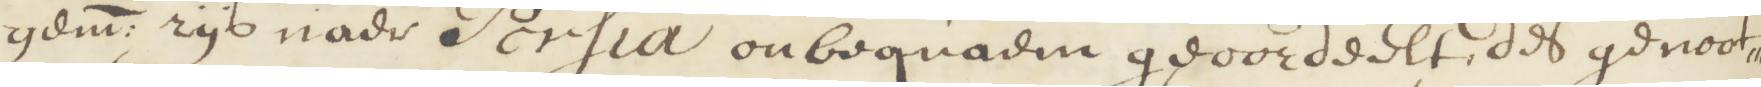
gem: rijs naer Persia onbequaem geoordeelt, des genoot„
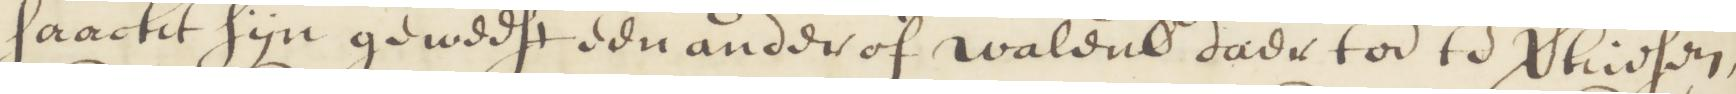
saackt sijn geweest een ander of walenb daer toe te verkiesen,
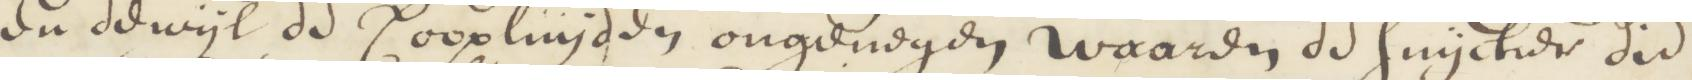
en dewijl de Coopluijden ongenegen waaren de suijcker die
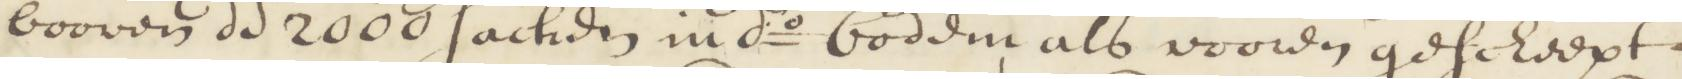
booven de 2000 sacken in d=o bodem als vooren gescheept
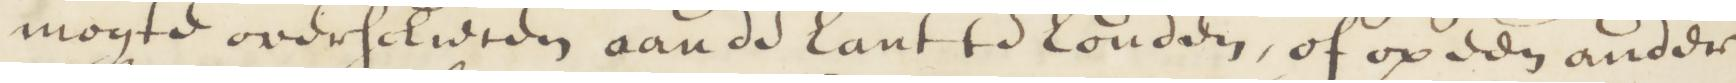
mogte overschieten aan de hant te houden, of op een ander
